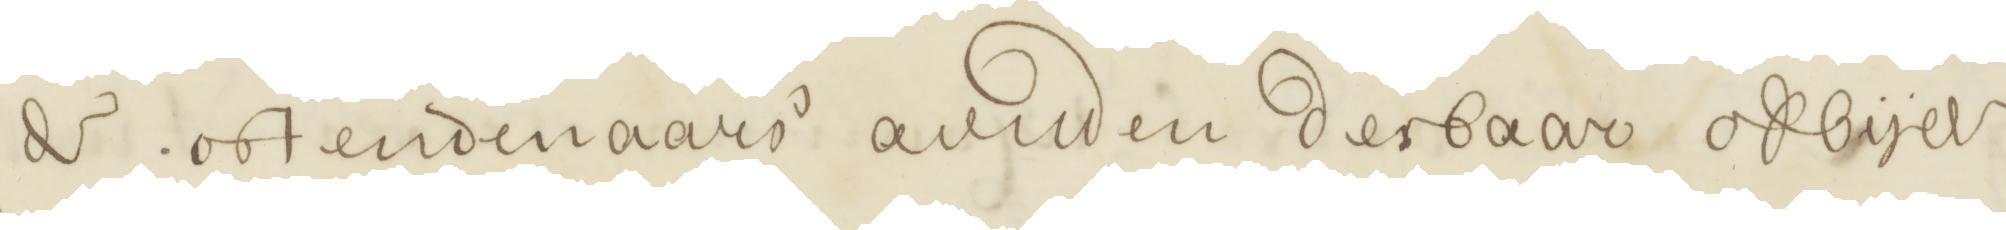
de ostendenaars aenden derbaar of bij de
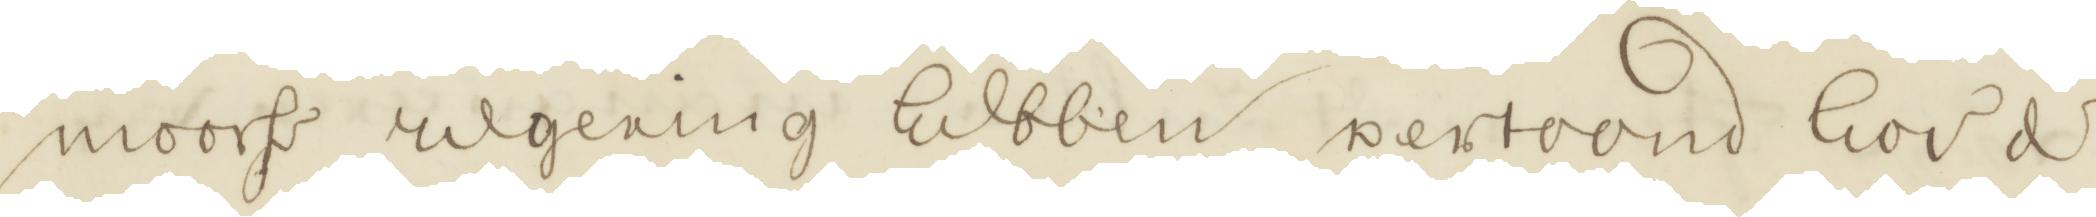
moorse regering hebben vertoond hoe de
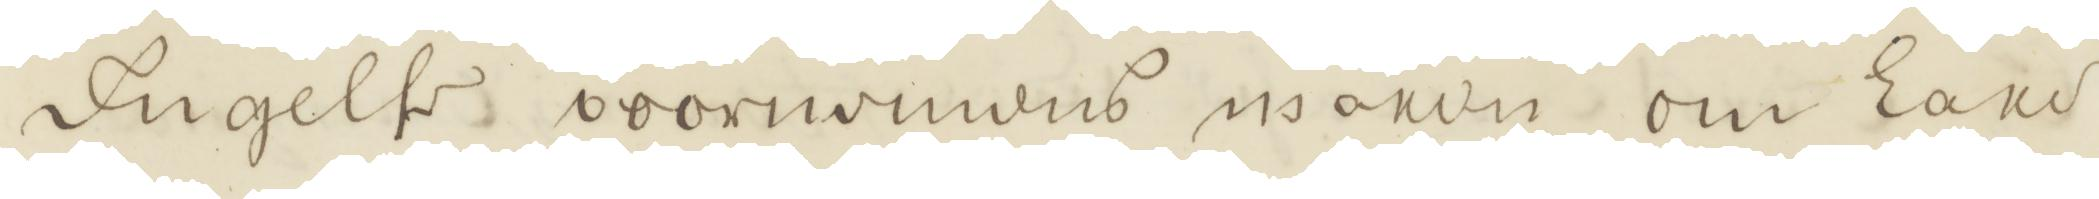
Engelse voornemens waren om hare
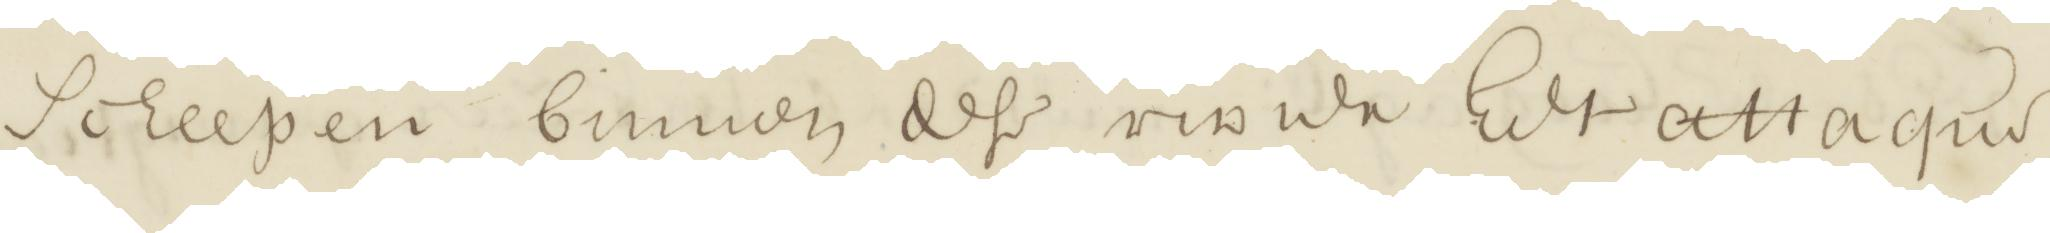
scheepen binnen dese rivier het attaque
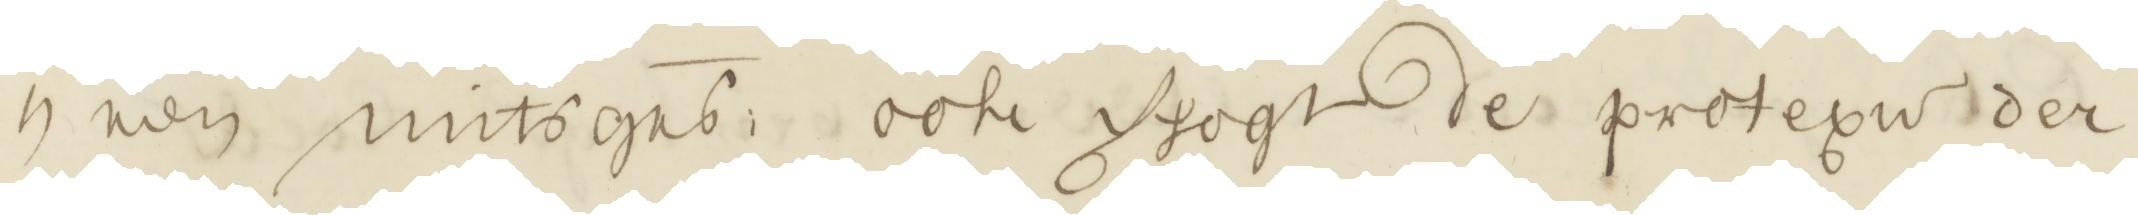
ren mitsgrs: ook versogt de protexie der
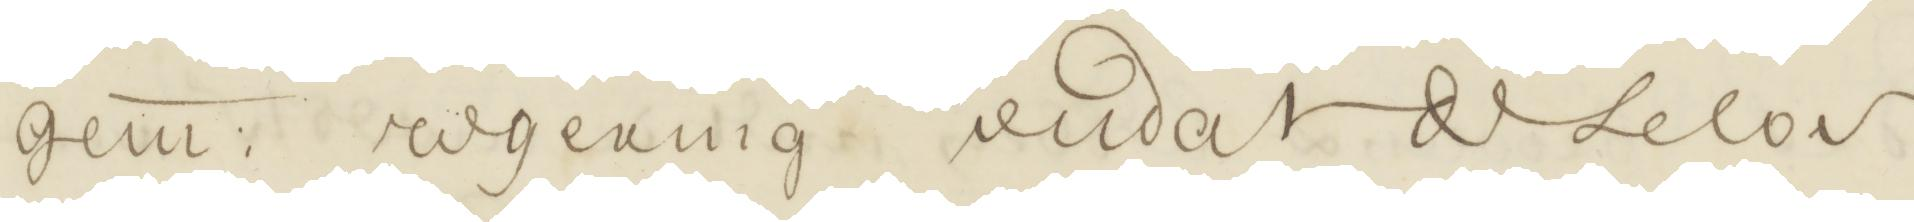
gem: regering endat deselve
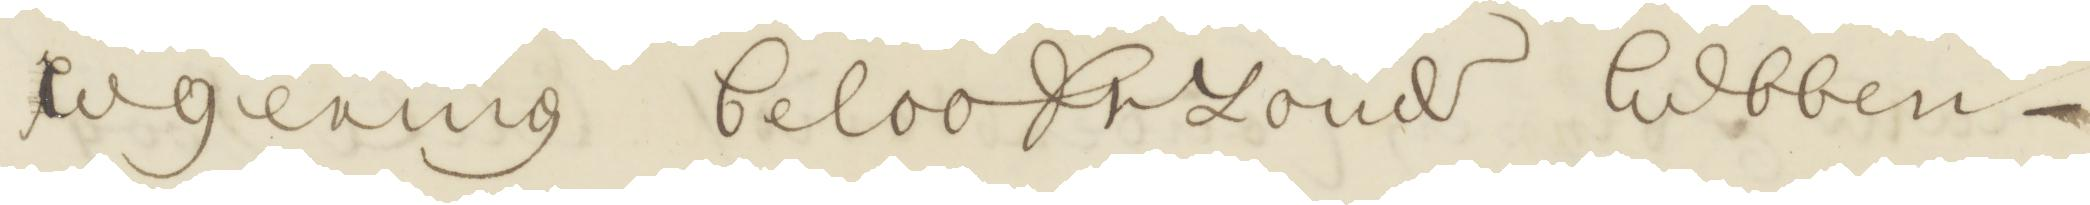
regering belooft zoude hebben -
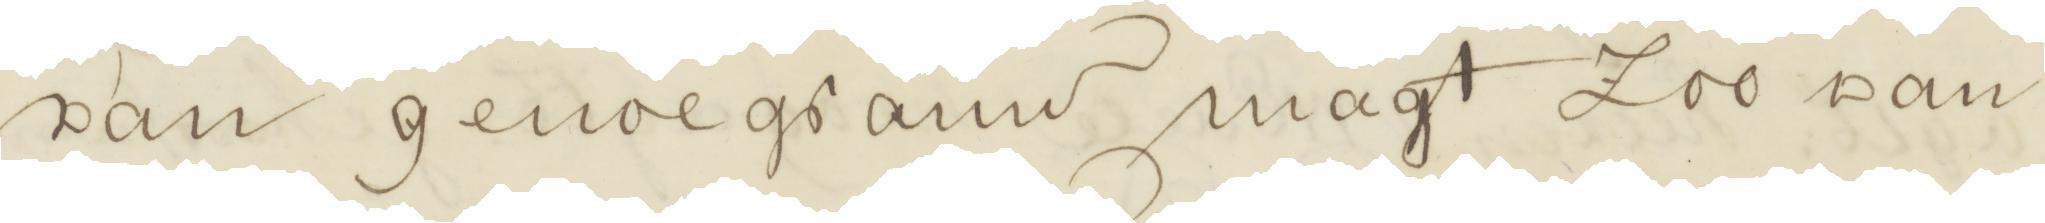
van genoegsame magt zoo van
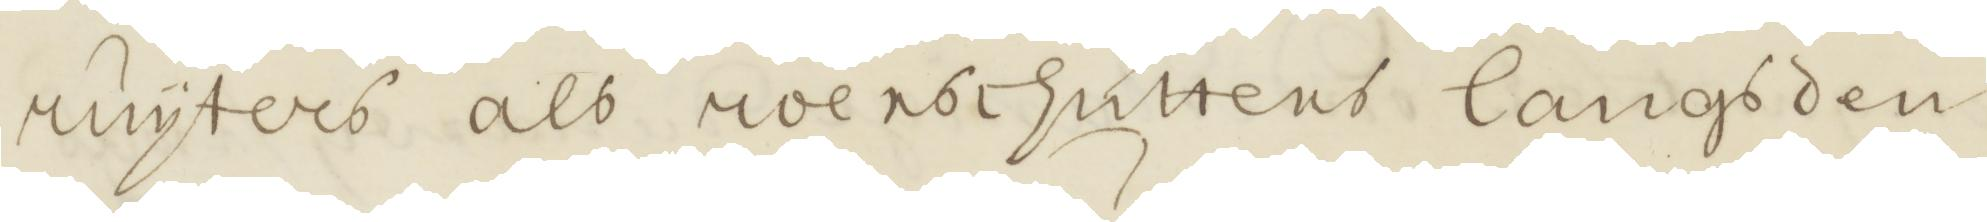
ruijters als roerschutters langs den
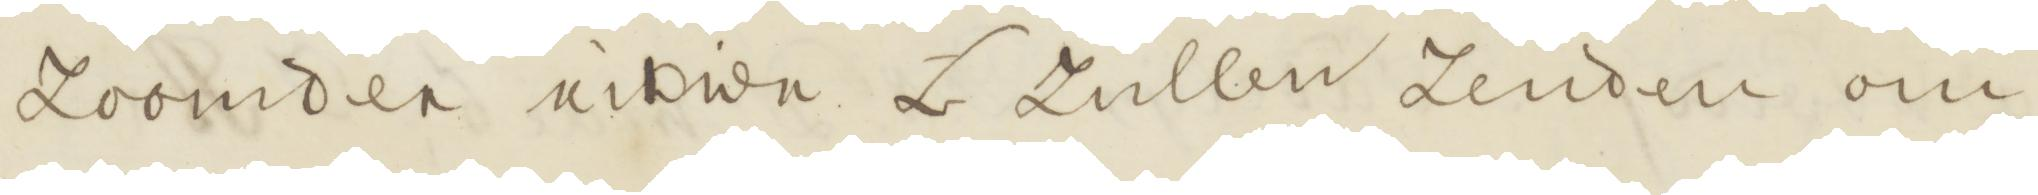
zoom der rivier te zullen zenden om
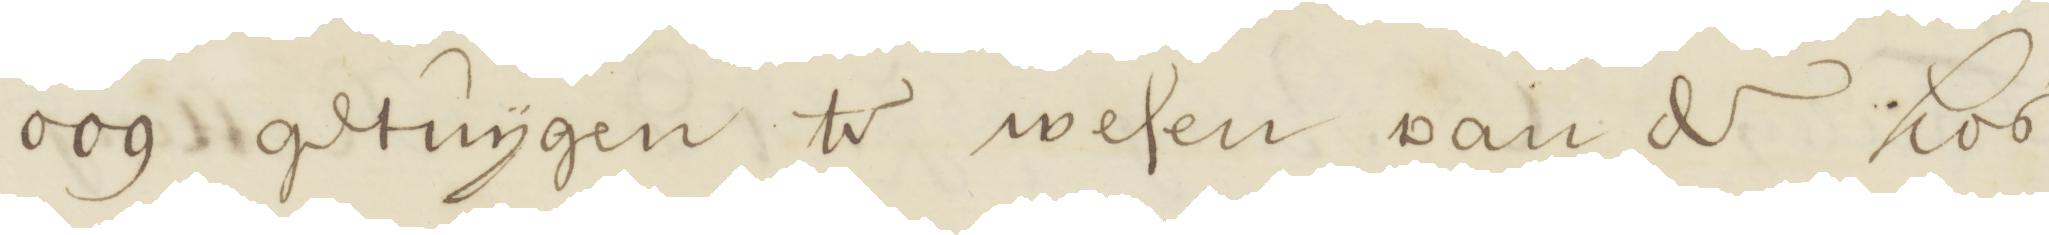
oog getuijgen te wesen van de hos
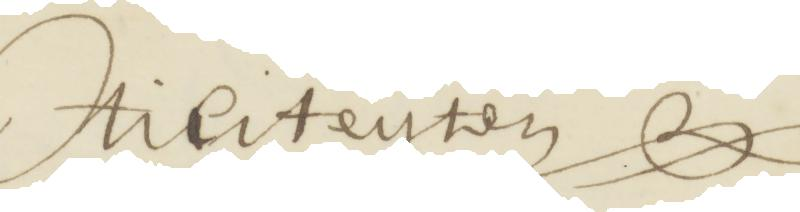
tiliteijten
